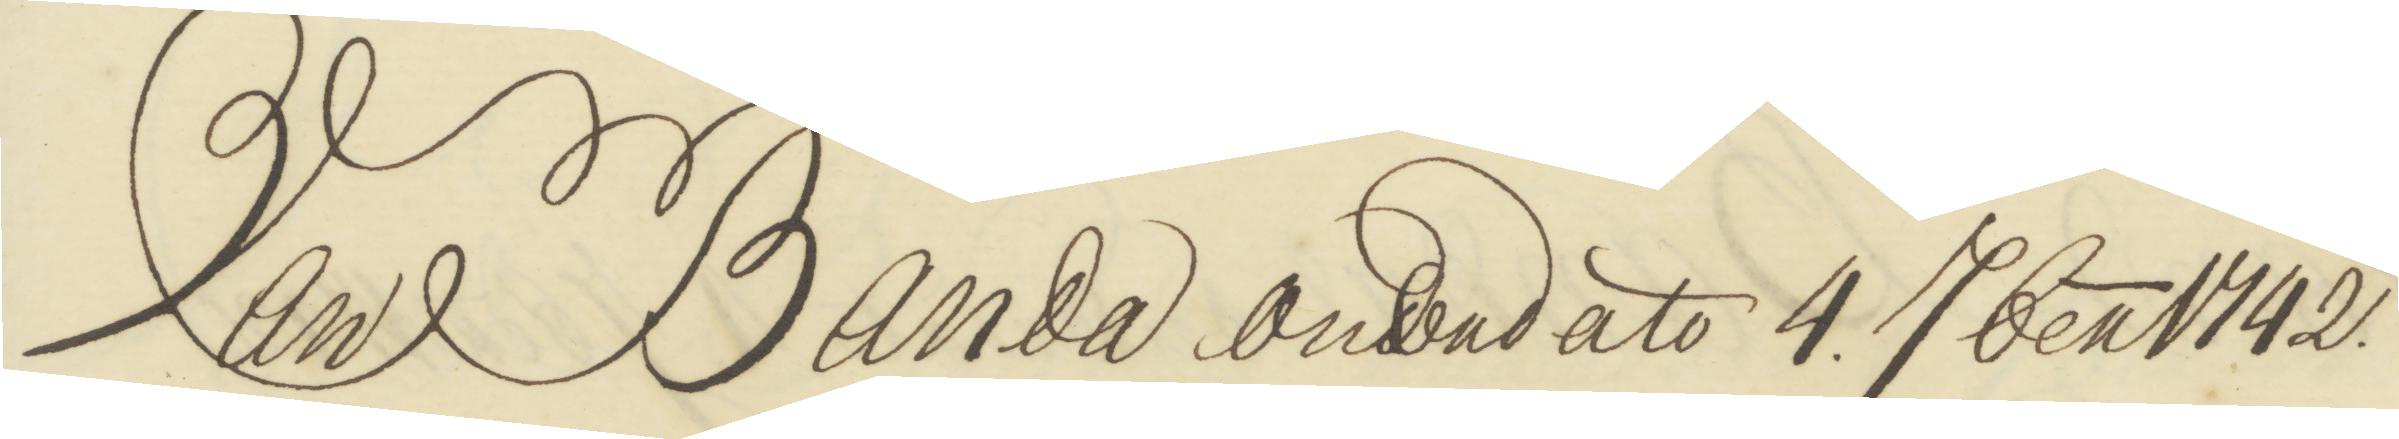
Van Banda onderdato 4: Jber: 1742.
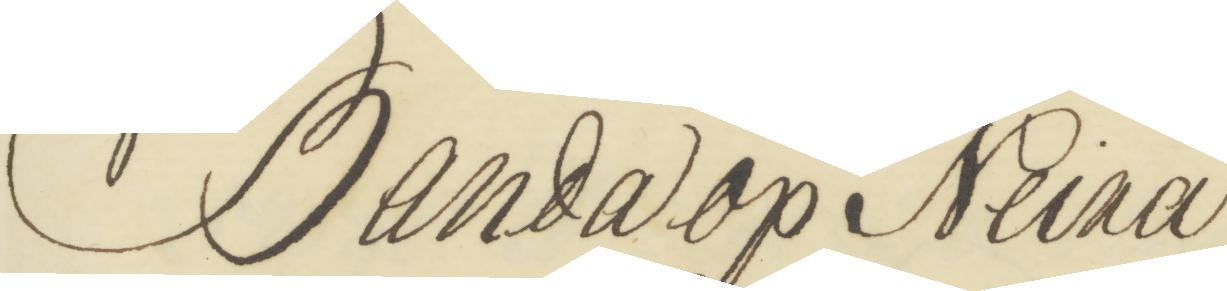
Banda op Neira
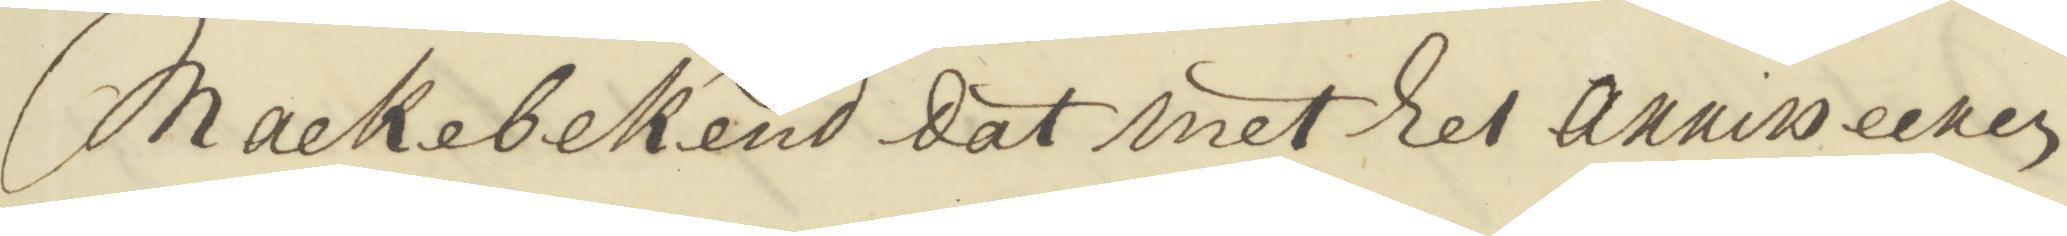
Maekebekend dat met het arriveeren
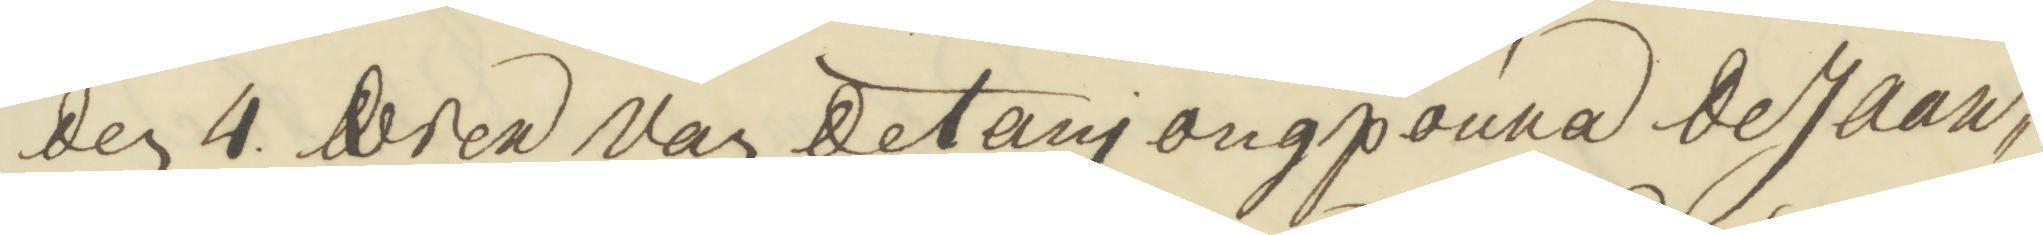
den 4. deser van detanjongpoura deJaar„
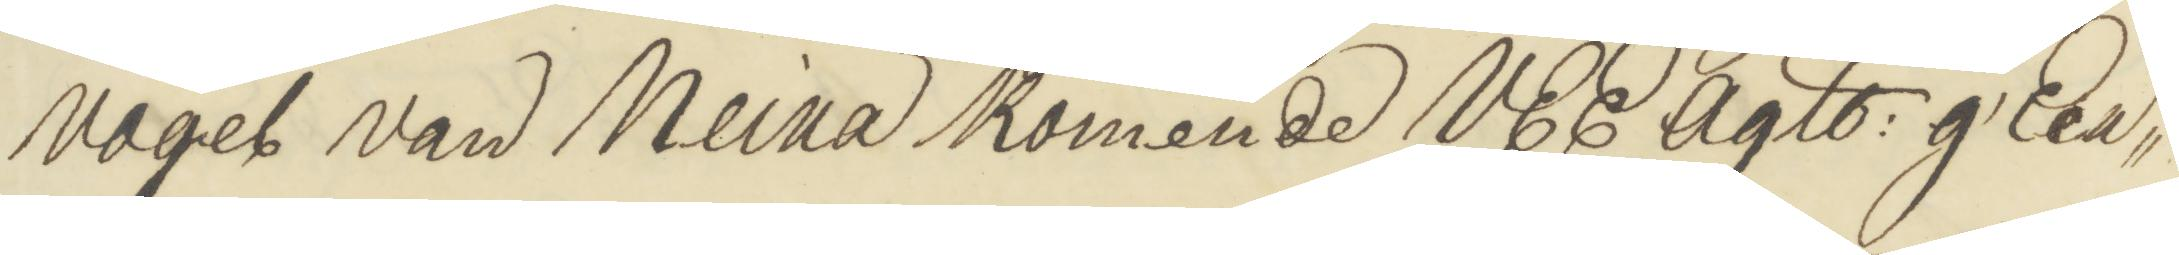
Vogel van Neira komende UEE Agtb: g’ Eer„
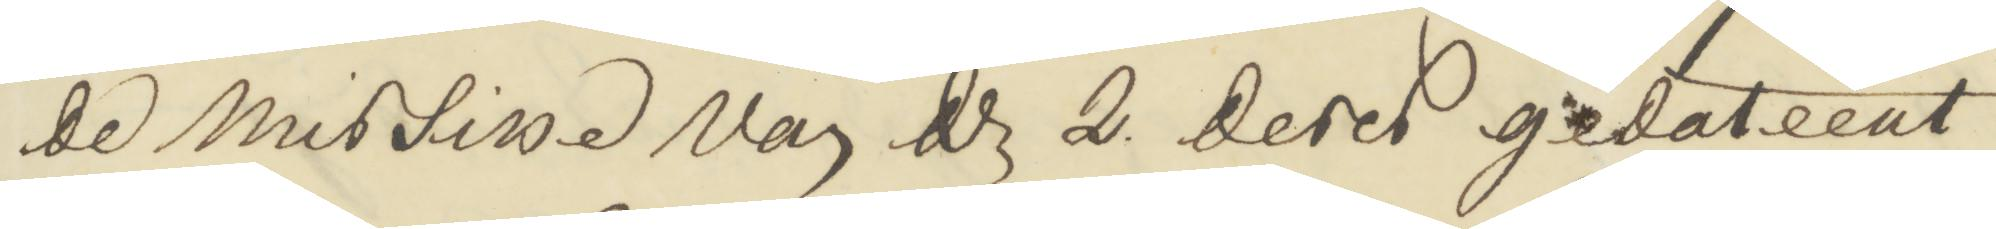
de missive van den 2. deses gedateert
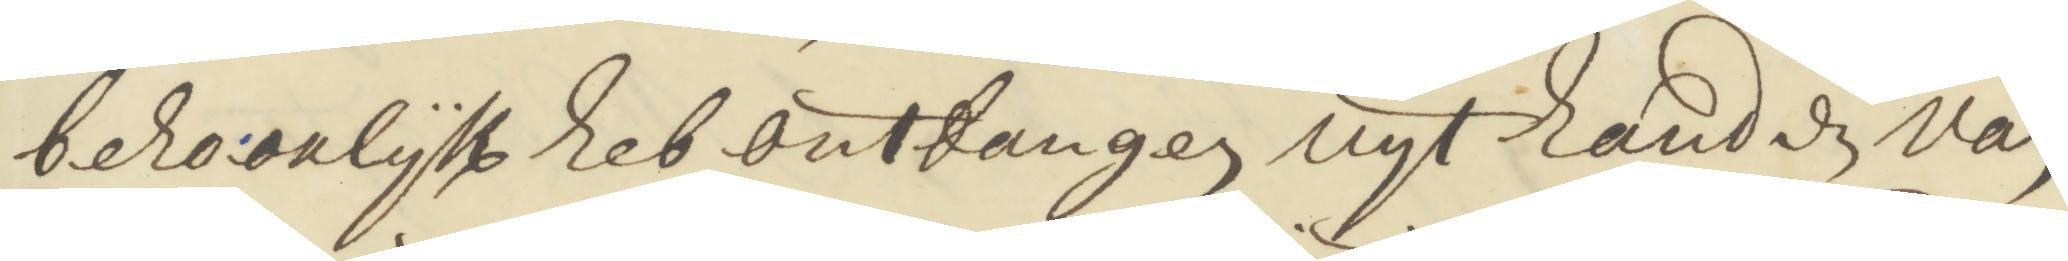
behoorlijk heb ontfangen uijt handen van
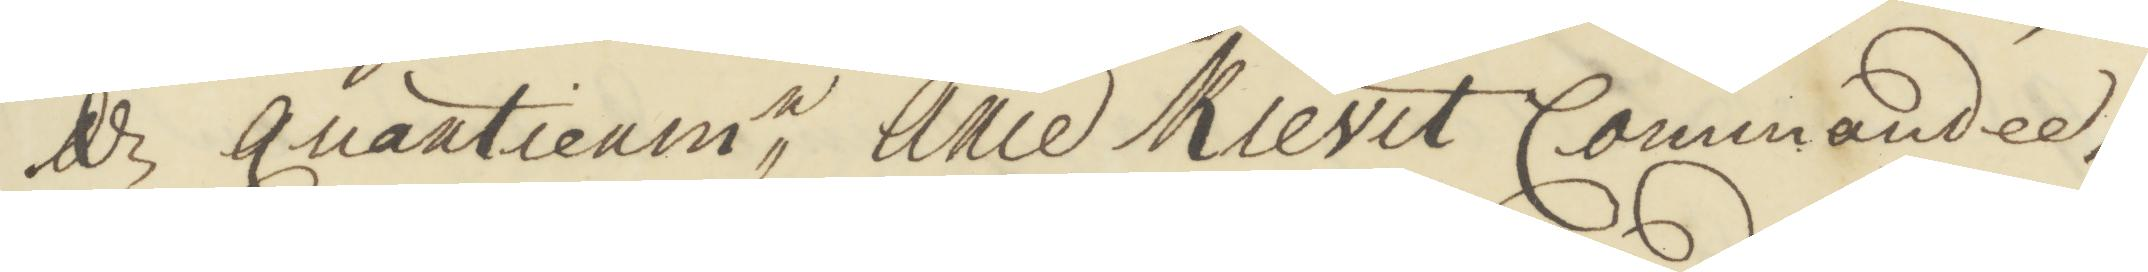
den quartierm„r Arie Kievit commandee„
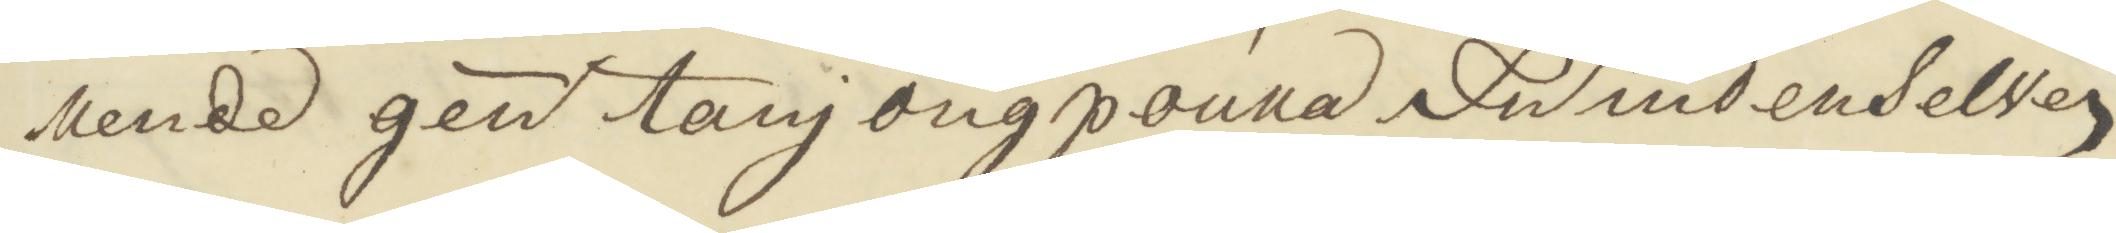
rende gen tanjongpoura en in denselven
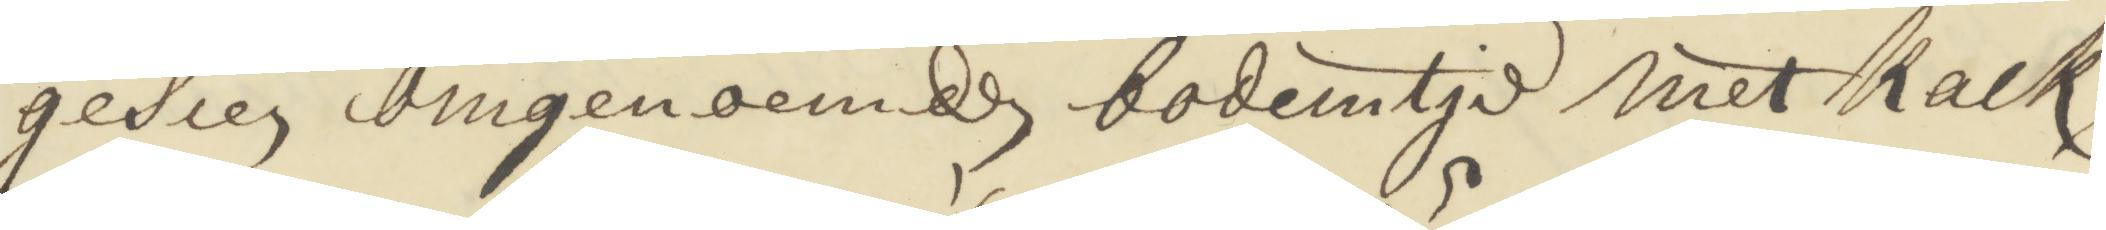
gesien omgenoemden bodemtje met kalk
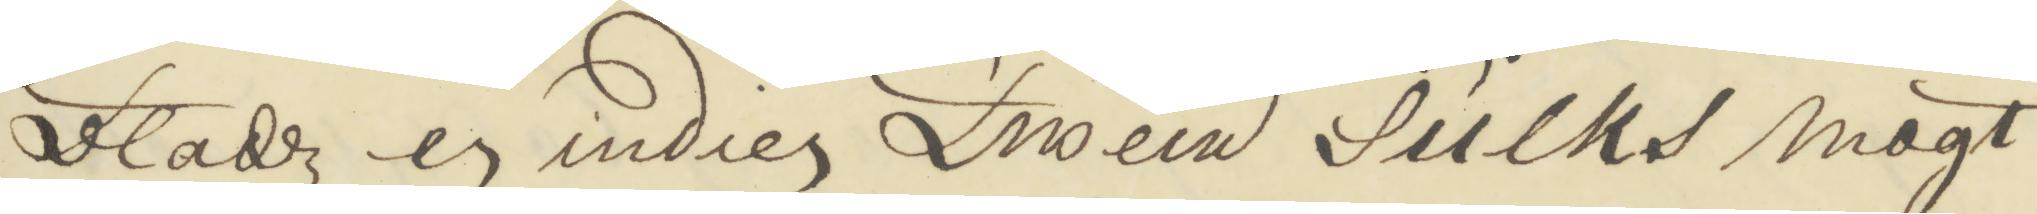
teladen en indien 'tweir sulks mogt
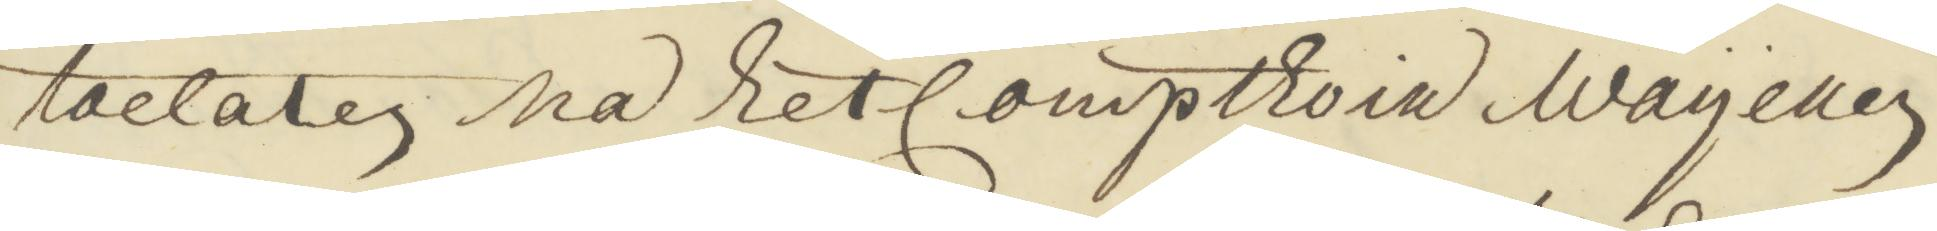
toelaten na het compthoir waijeren
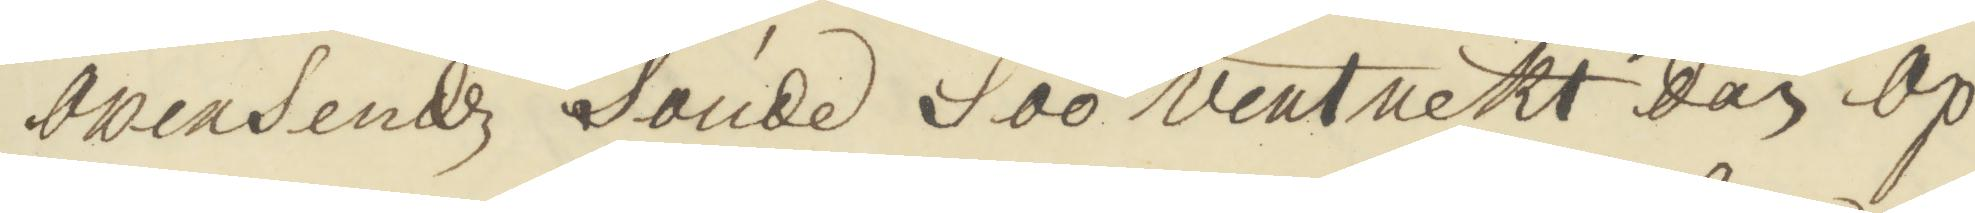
oversenden soude soo vertrekt dan op
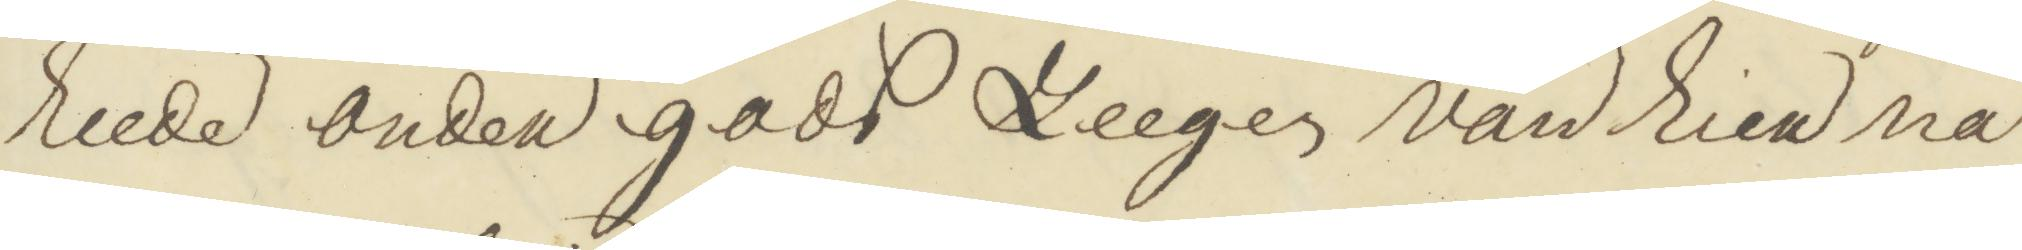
heede onder gods zeegen van hier na
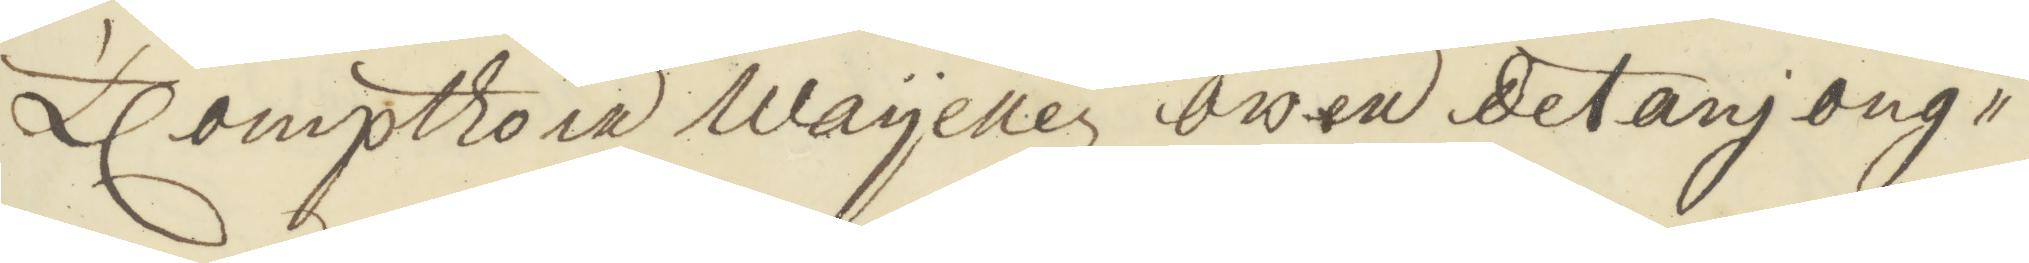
'tcompthoir Waijeren over detanjong„
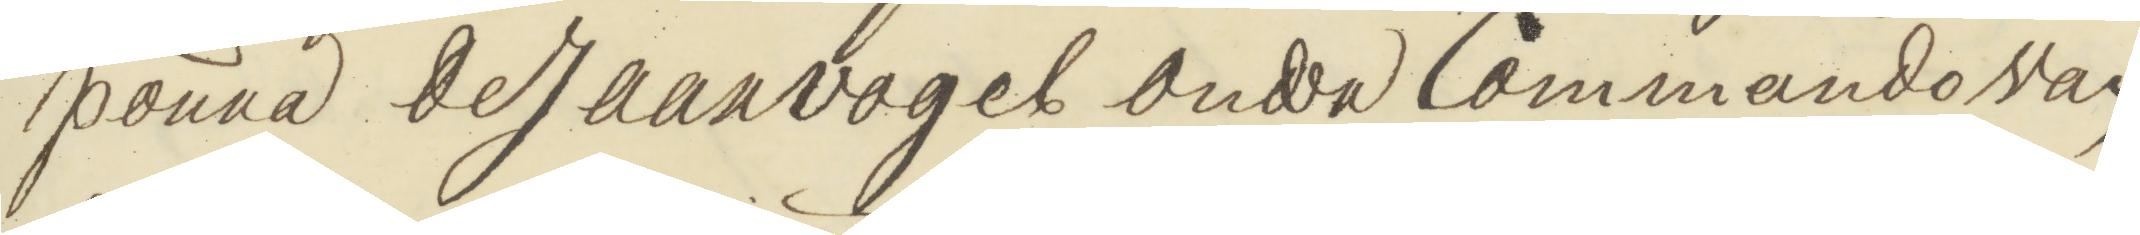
poura deJaarvogel onder Commando van
